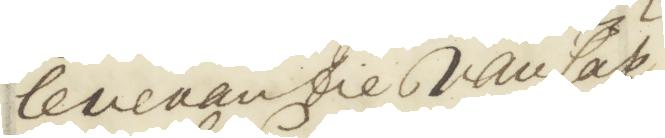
leverantie van sap
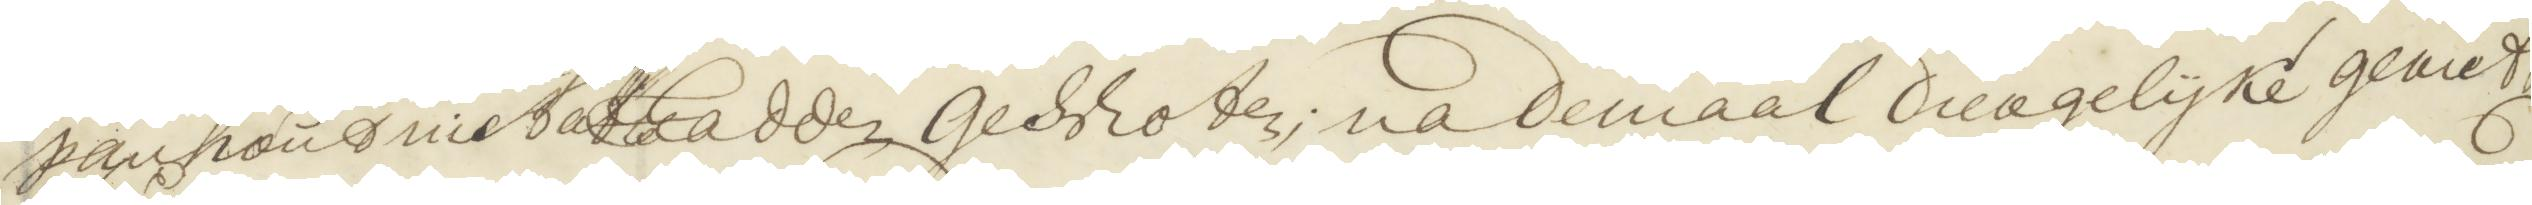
panhout niet af hadden geschoten; na demaal diergelijke gerief
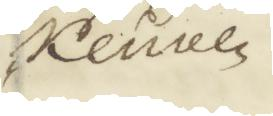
keuren
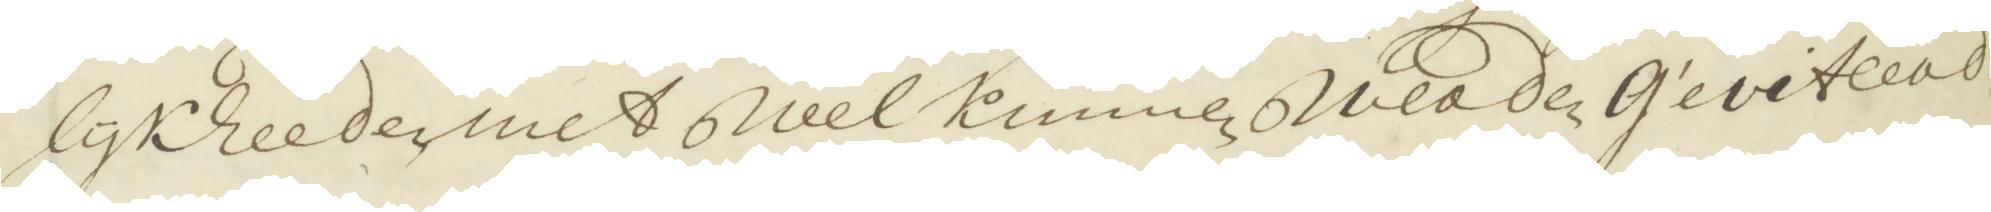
lijkheeden met veel kunnen werden g’eviteerd
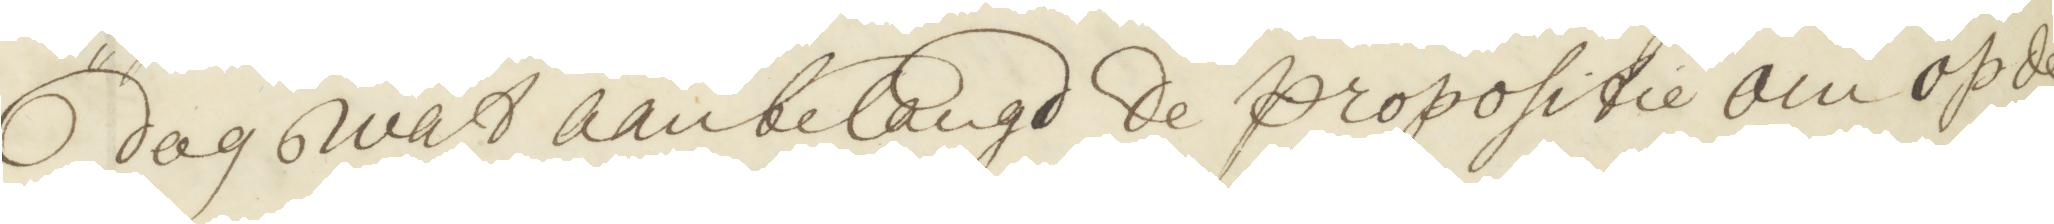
dag wat aan belangd de propositie om op de
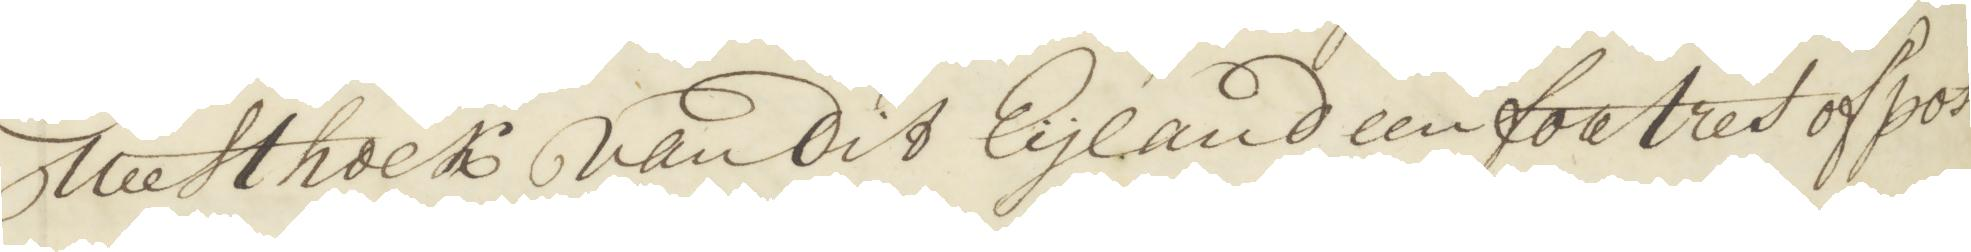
Westhoek van dit Eijland een fortres of pos
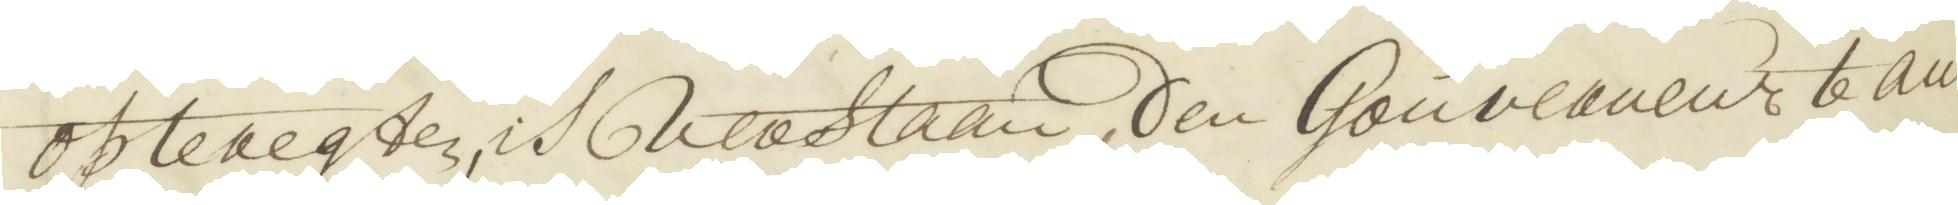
op te regten, is verstaan, den Gouverneur te an
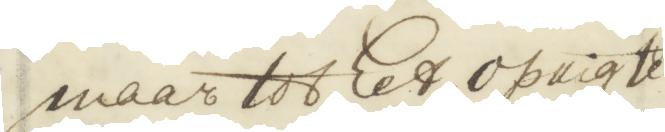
maar tot het oprigte
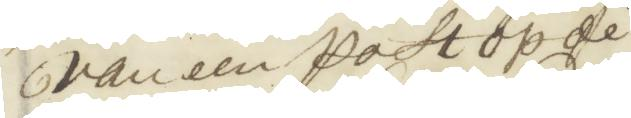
van een post op de
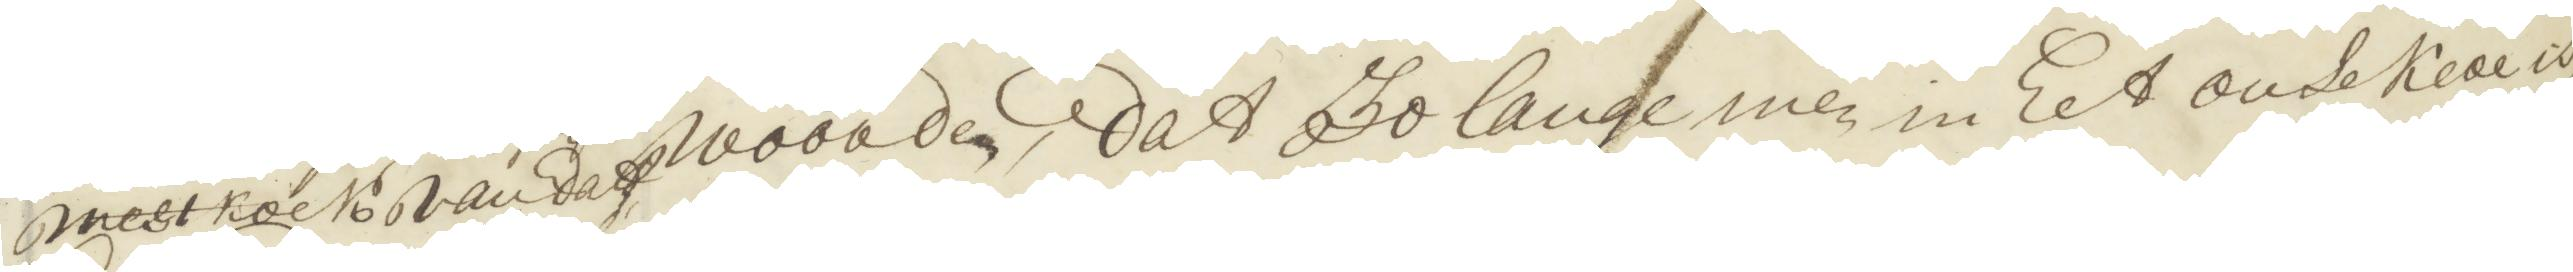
westhoek van dat woorden, dat zo lange men in het onsekere is
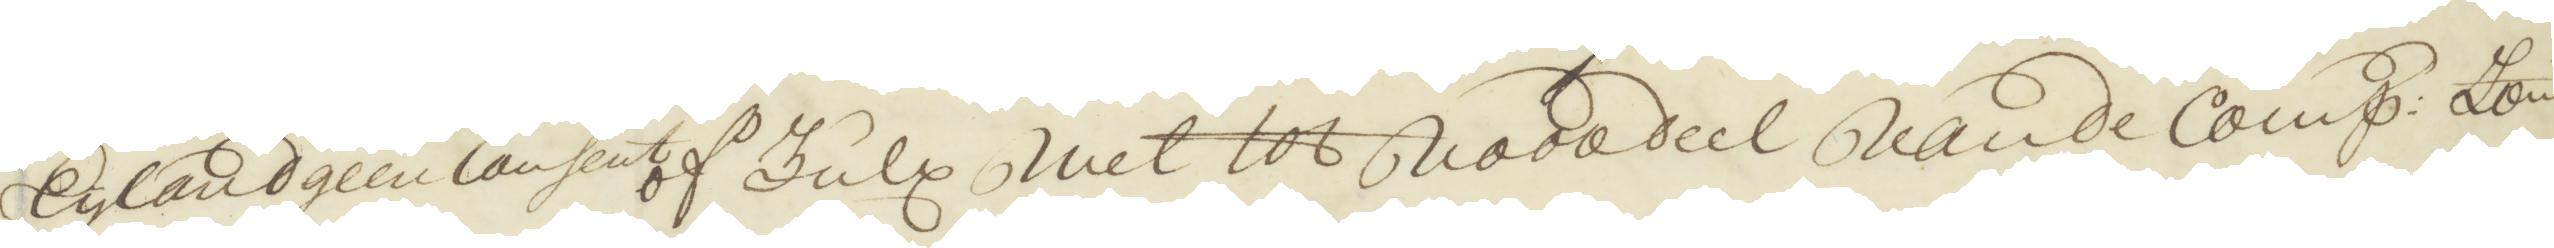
Eijland geen consent of zulx wel tot voordeel van de Comp: zou
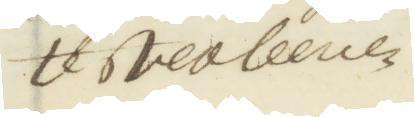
te verleenen
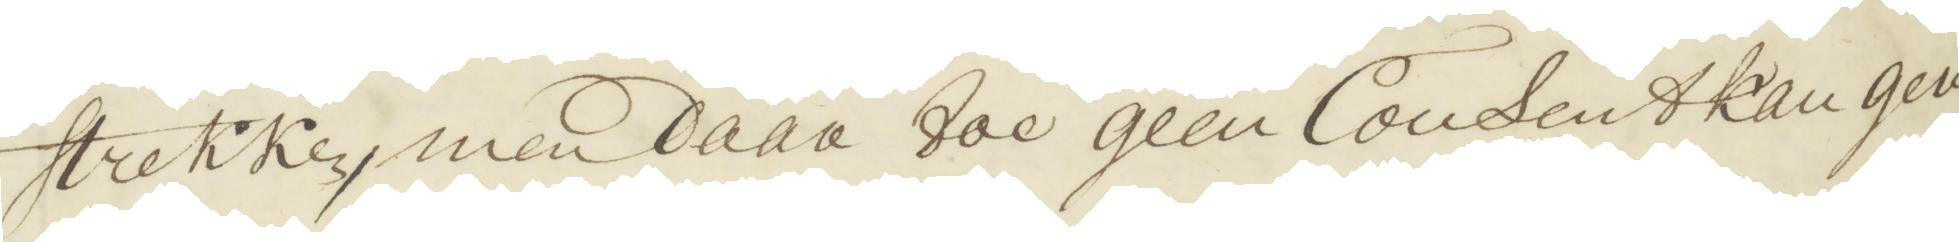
strekken, men daar toe geen consent kan gev
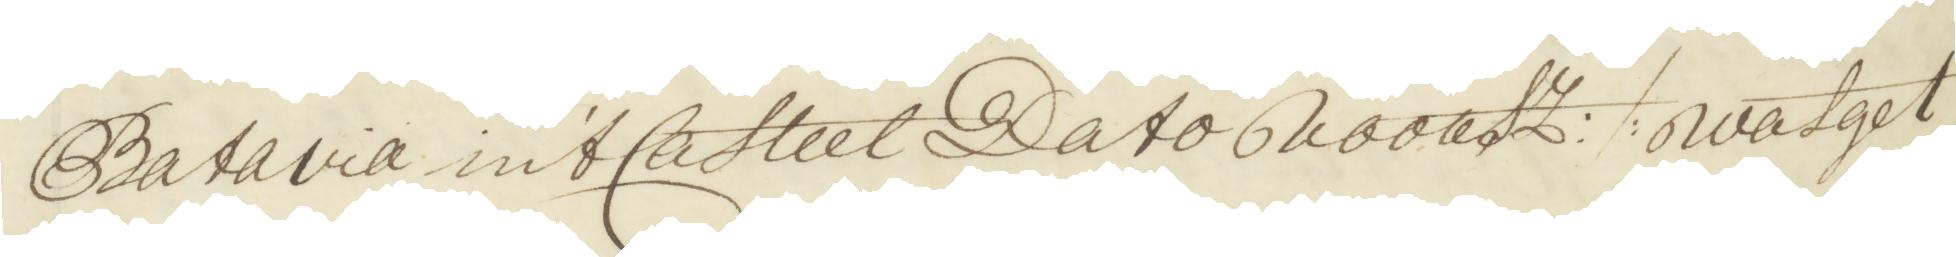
Batavia in ’t Casteel Dato voorsz: /:watget
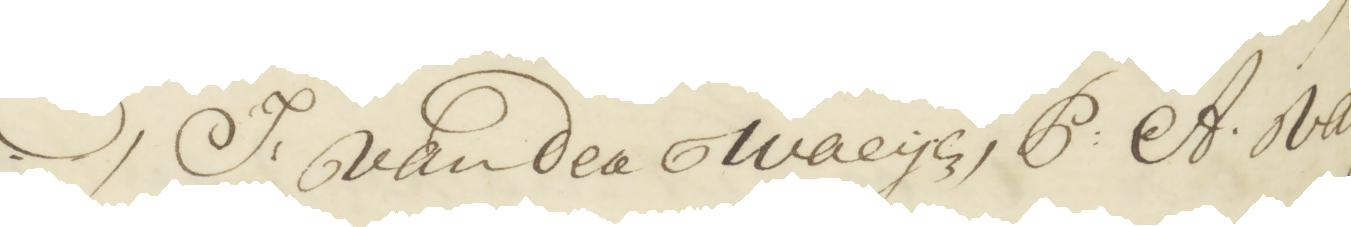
. , J: van der waeijen, P: A. va
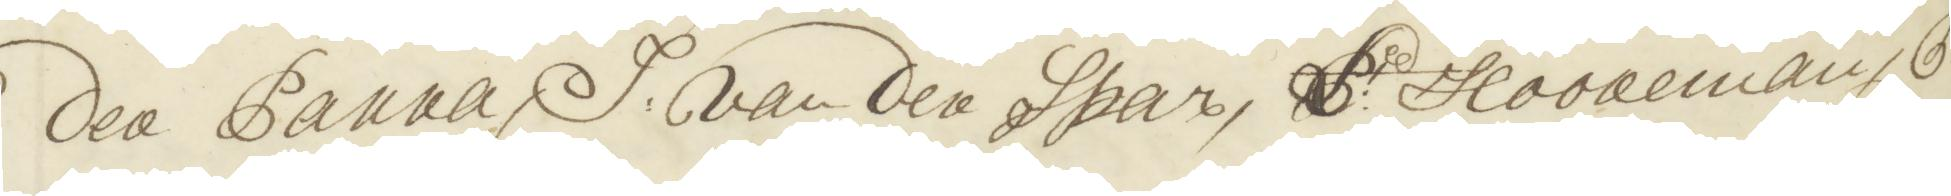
der Parra, J: van den Spar, P: Hooreman, E
